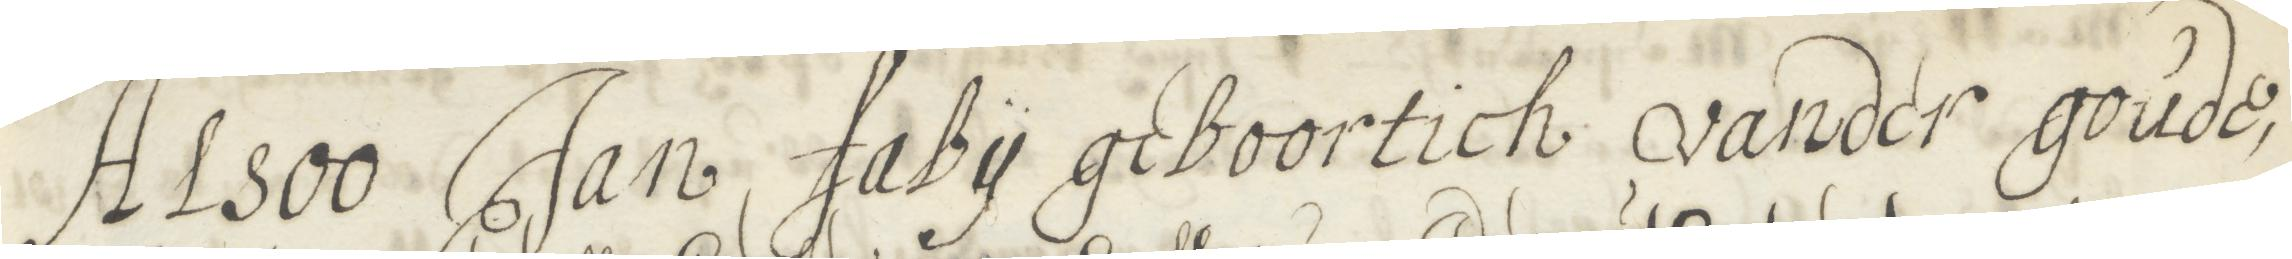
Alsoo Jan fabij geboortich vander goude,
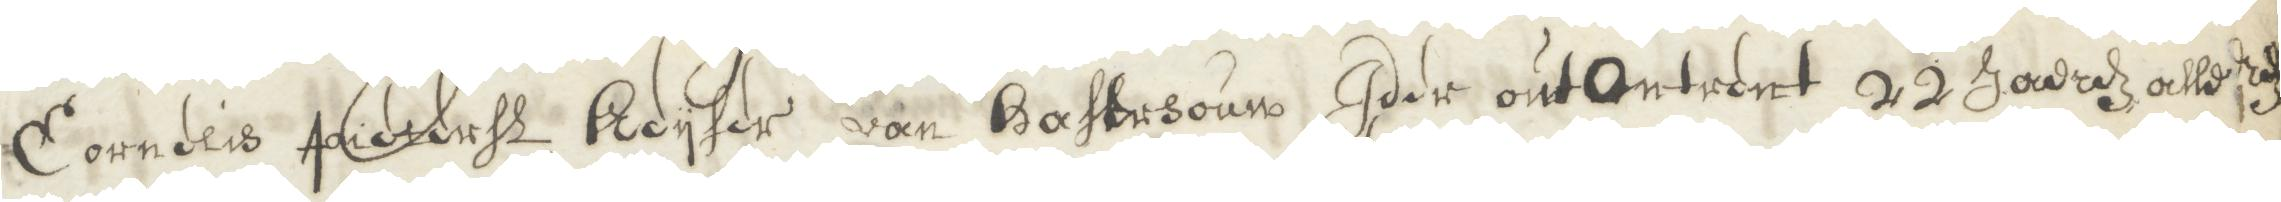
Cornelis pietersz keijser van hasersouw Ider out Ontrent 22 Jaeren alle
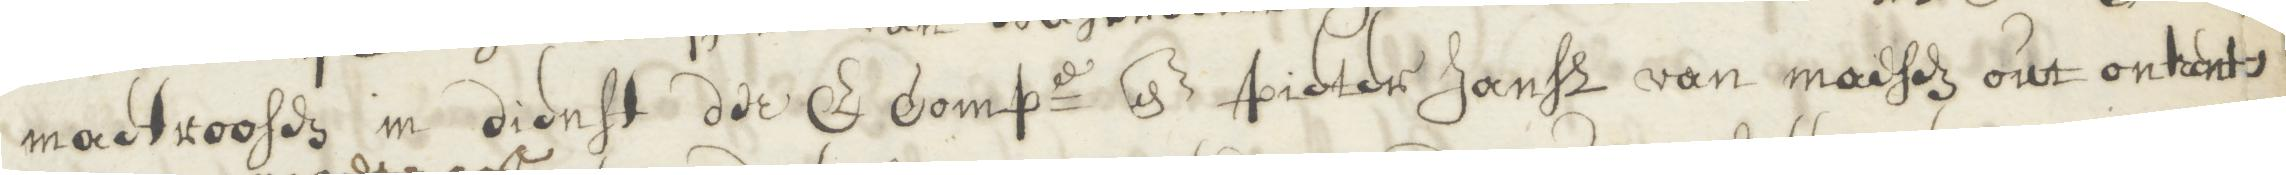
maetroosen in dienst der E Comp=e ende pieter Jansz van maesen out ontrent
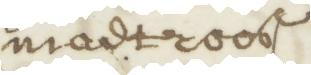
maetroos
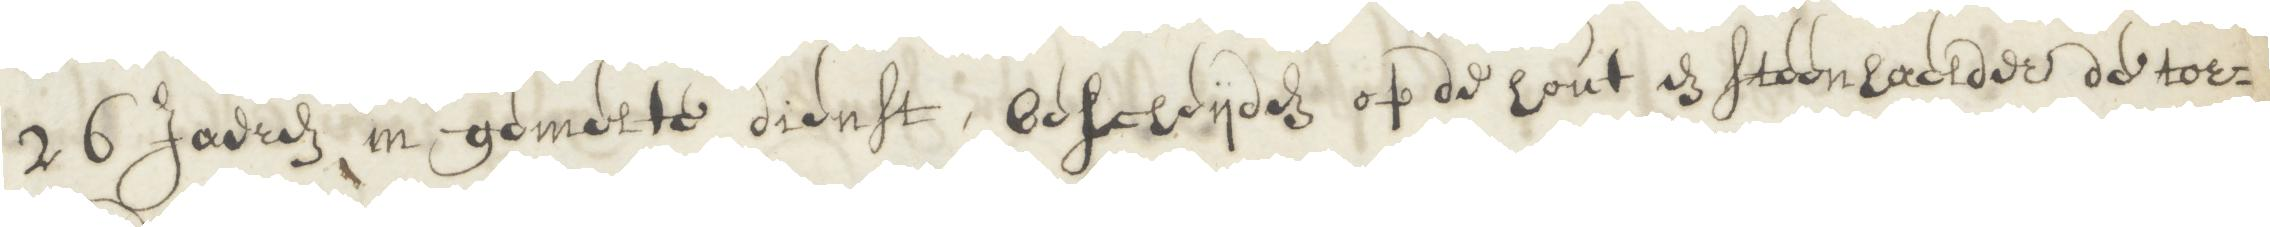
26 Jaeren in gemelte dienst, bescheijden op de hout en steenhaelder de tor=
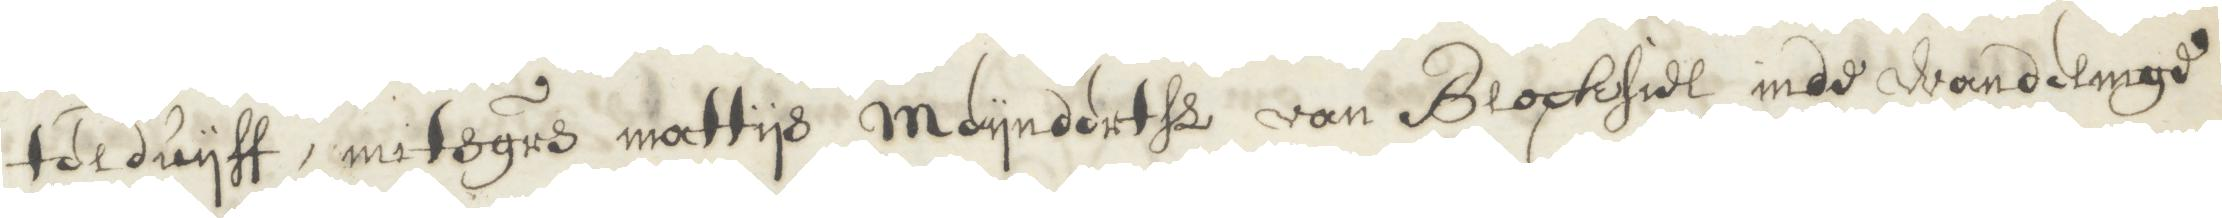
tel duijff, mitsgrs mattijs Meijndertsz van Blocksiel inde wandelinge
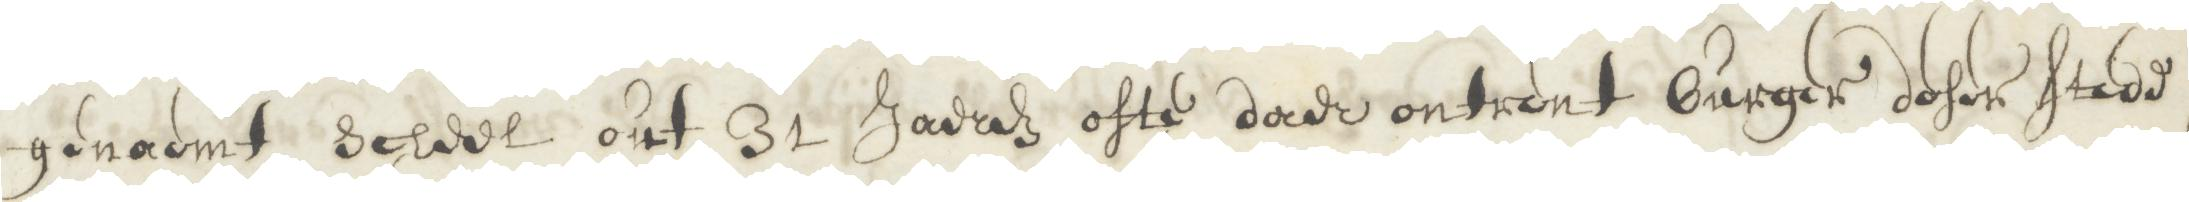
genaemt scheel out 31 Jaeren ofte daer ontrent burger deser stede
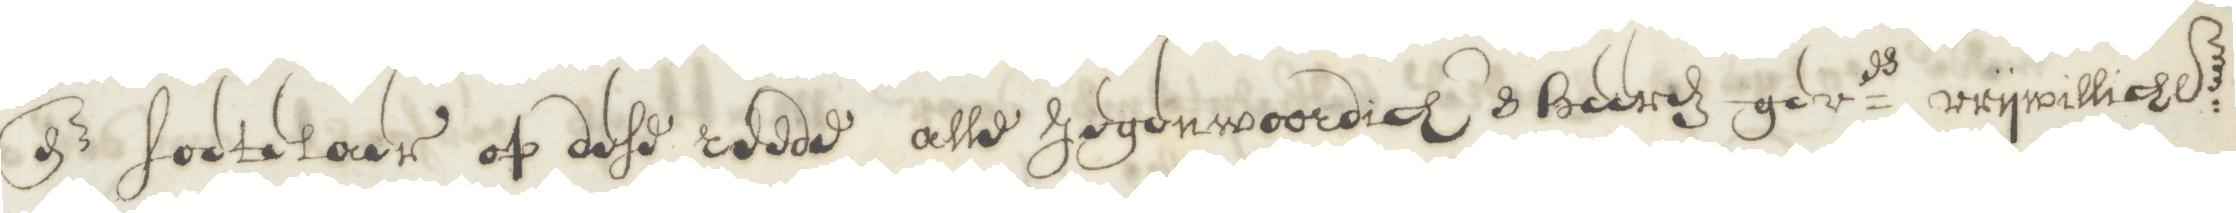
ende soetelaer op dese reede alle Jegenwoordich 's heeren gev=es vrijwillichlijk
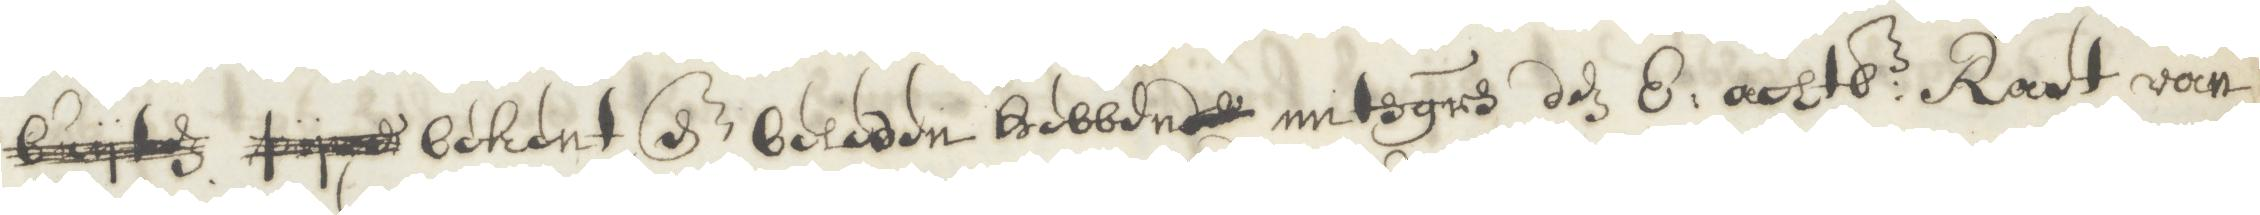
buijten pijne bekent ende beleden hebbende mitsgrs den E: achtb: Raet van
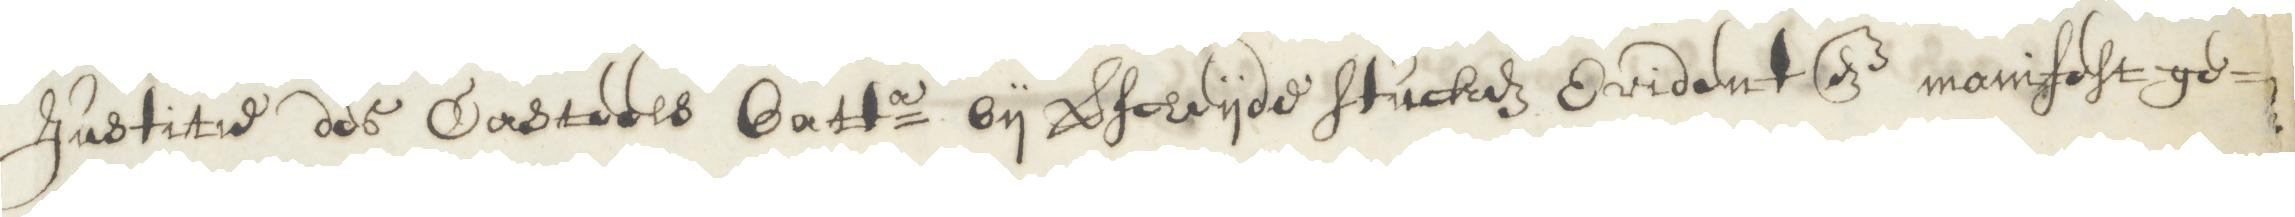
Justitie des Casteels batt=a bij verscheijde stucken Evident ende manifest ge=
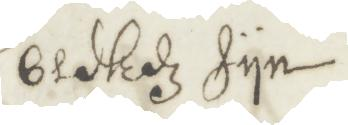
bleken sijn
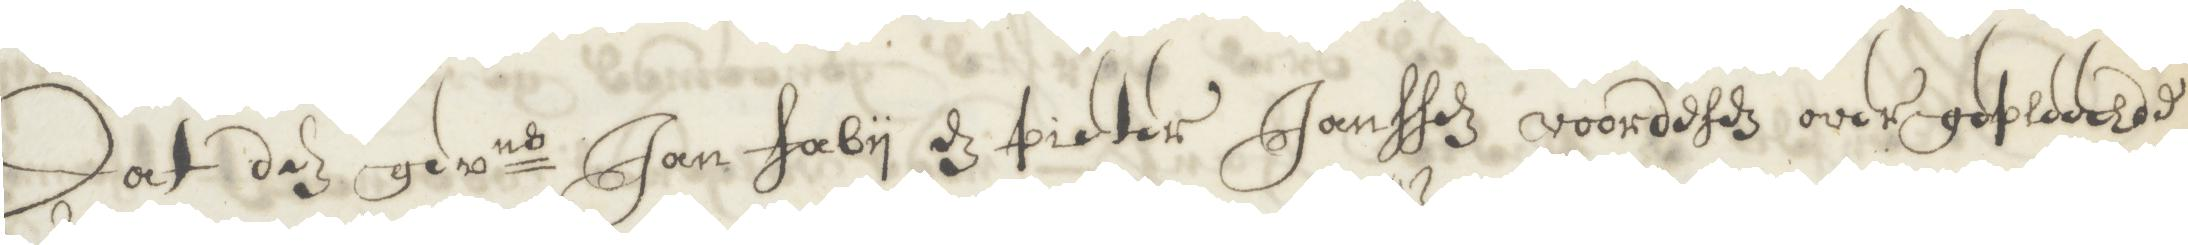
Dat den gev=ns Jan fabij en pieter Janssen voordesen over gepleechde
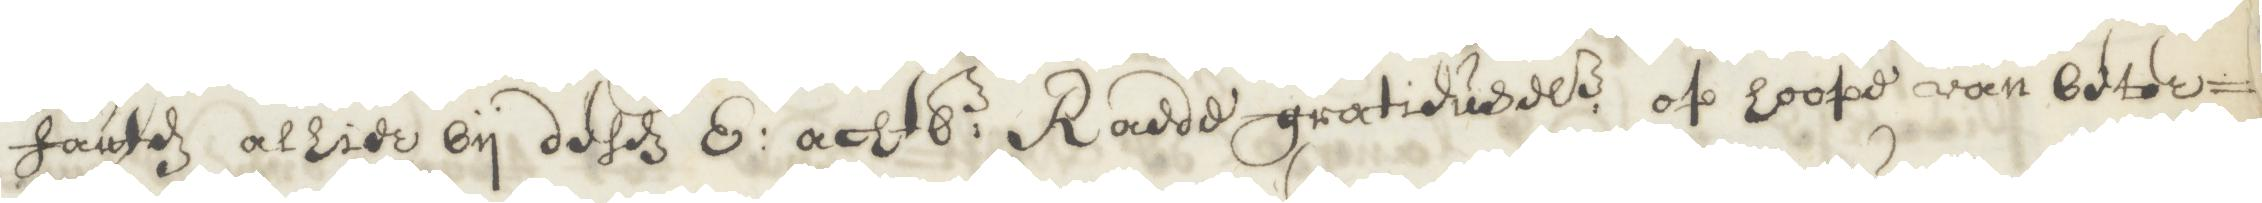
fauten alhier bij desen E: achtb: Raede gratieuselijk op hoope van beter=
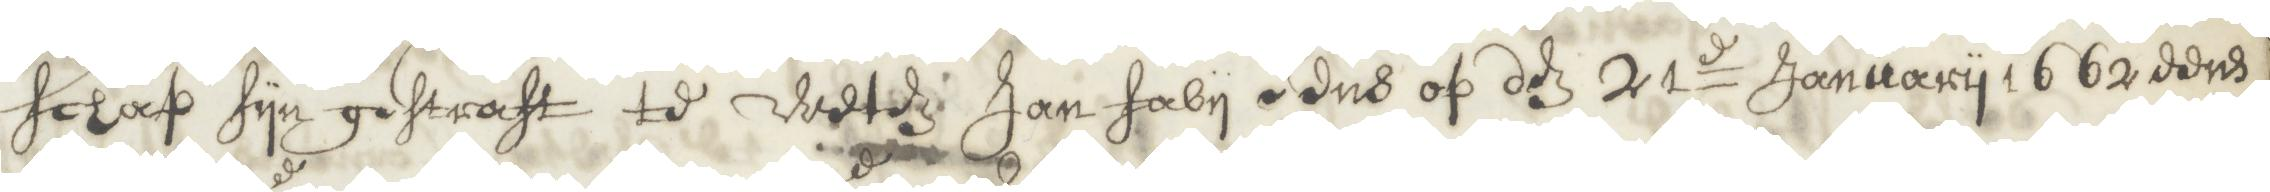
schap sijn gestraft te weten Jan fabij eens op den 21=e Januarij 1662 eens
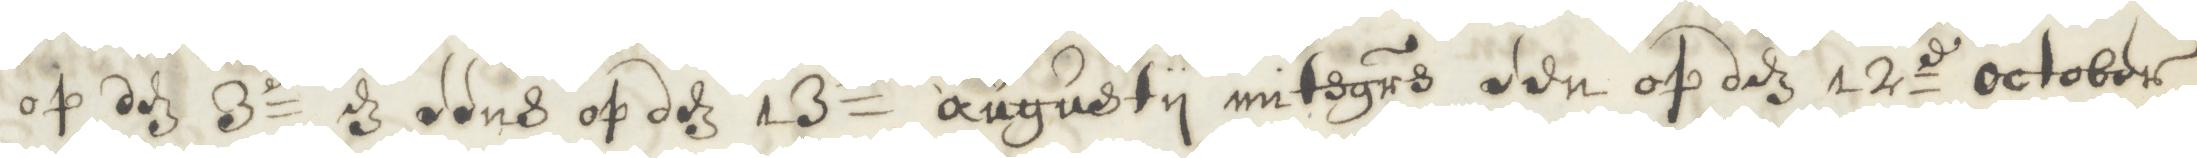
op den 3=e en eens op den 13=e augustij mitsgrs een op den 12=e october
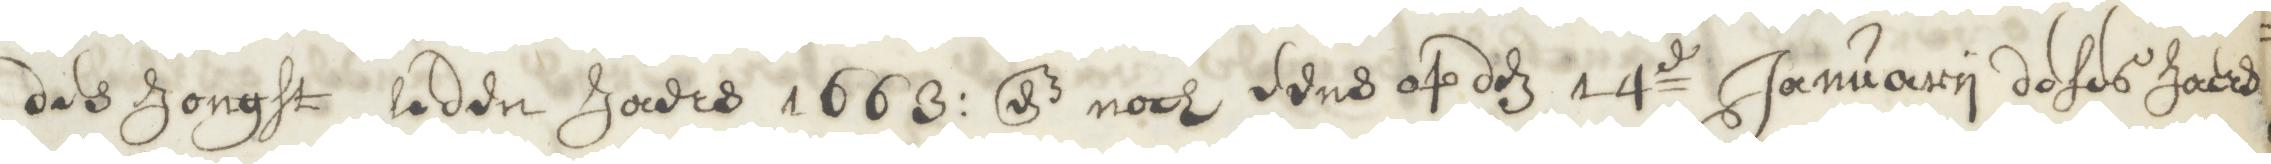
des Jongst leden Jaers 1663: ende noch eens op den 14=e Januarij deses Jaers
